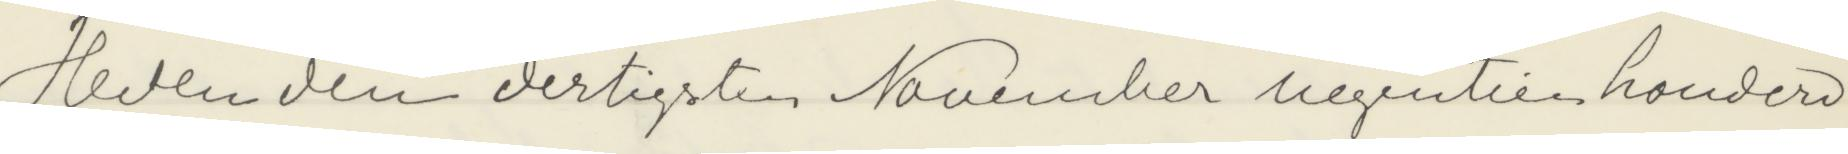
Heden den dertigsten November negentien honderd
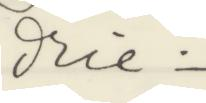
drie.
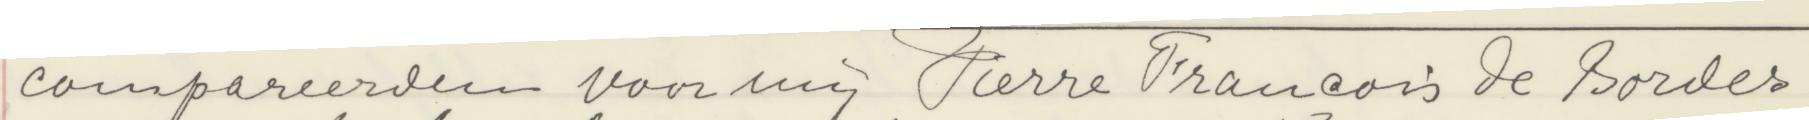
compareerden voor mij Pierre François de Bordes
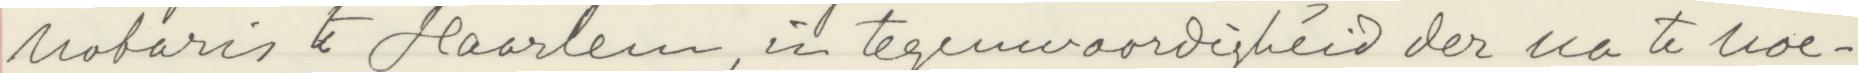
notaris te Haarlem, in tegenwoordigheid der na te noe-
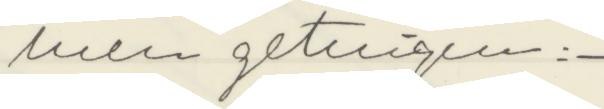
men getuigen:-
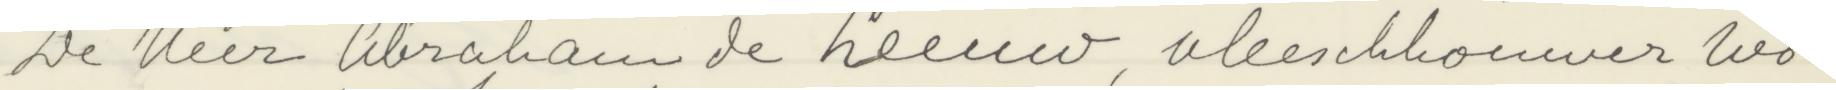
De Heer Abraham de Leeuw, vleeschhouwer Wo-
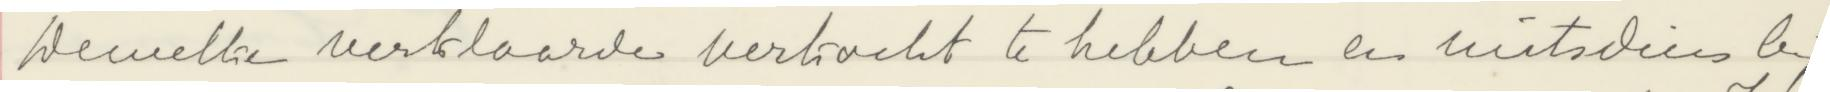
Dewelke verklaarde verkocht te hebben en mitsdien bij
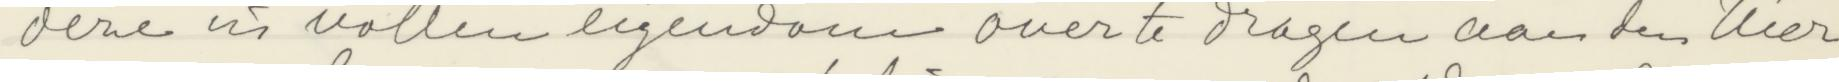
deze in vollen eigendom over te dragen aan den Heer
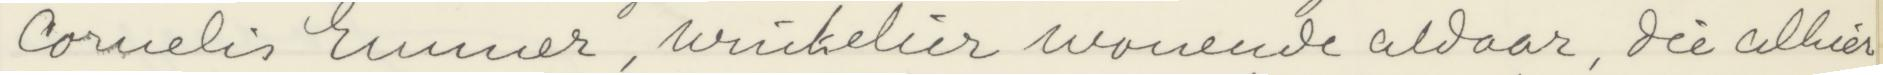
Cornelis hunner, winkelier wonende aldaar, die alhier
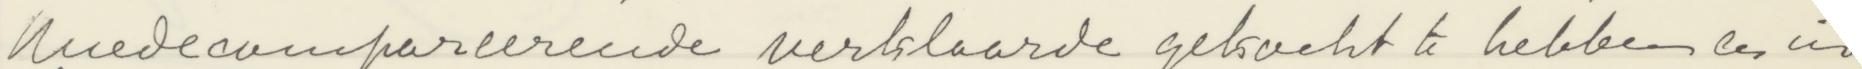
mede compareerende verklaarde gekocht te hebben en in
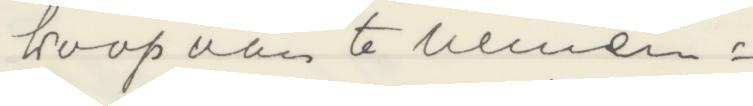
koop aan te nemen:
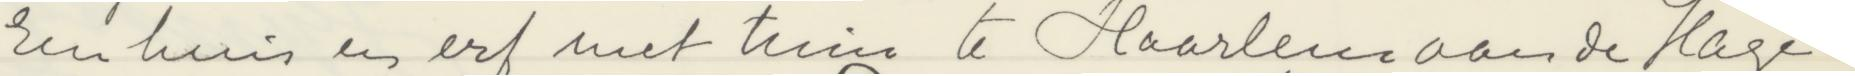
Een huis en erf met tuin te Haarlem aan de Hage-
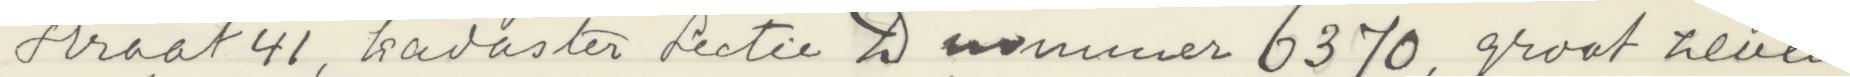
straat 71, kadaster sectie D nommer 6370, groot zeven
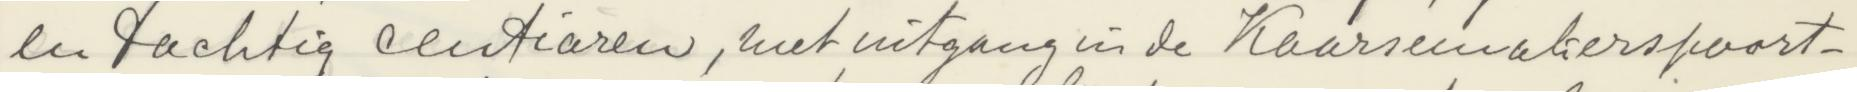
en tachtig Centiaren, met uitgang in de Kaarsemakerspoort-
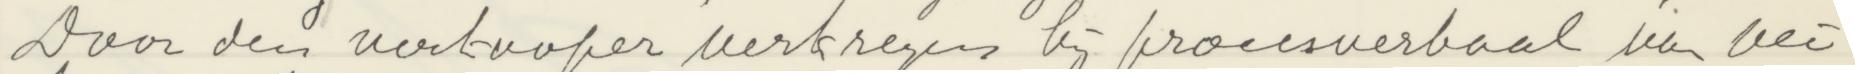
Door den verkooper verkregen bij procesverbaal van vei
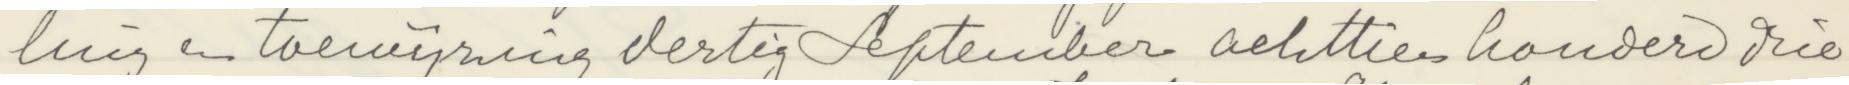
ling en toewijzing dertig September achttien honderd drie
